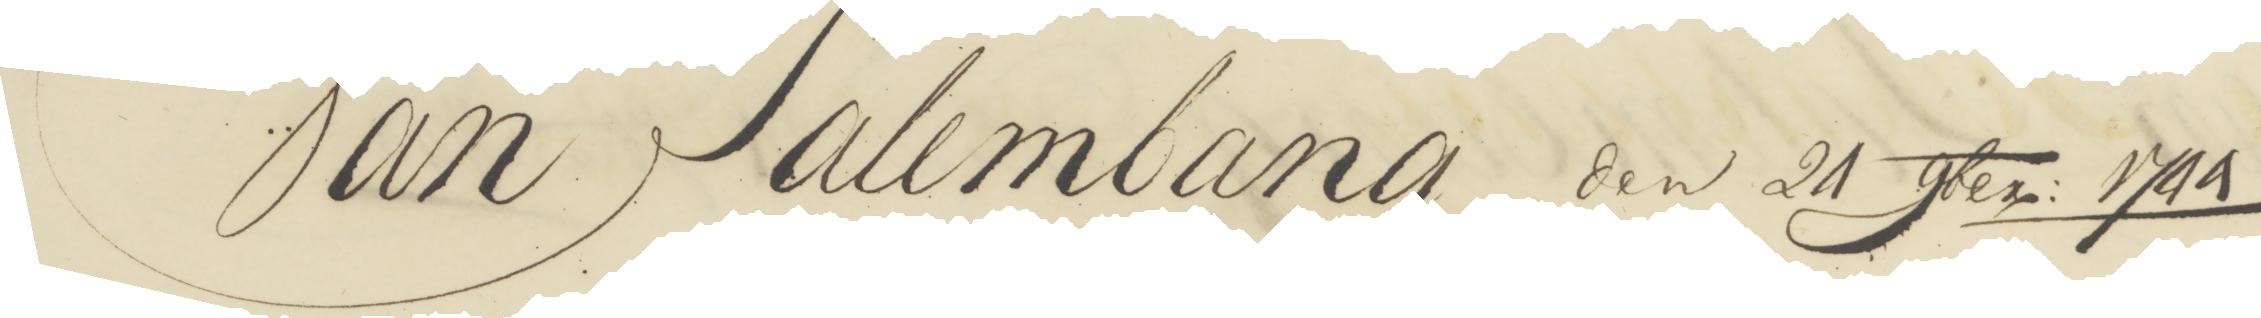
Van Palembang den 24 9ber: 1744
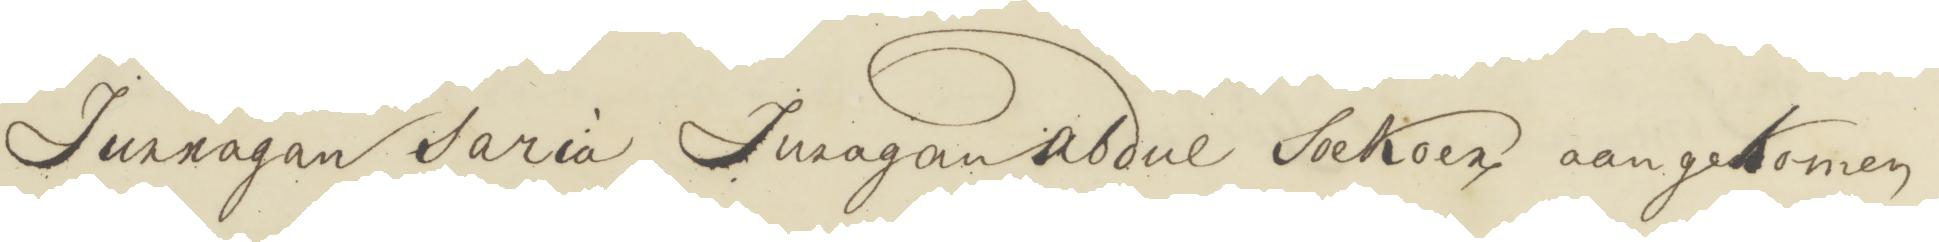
Iurragan Saria, Iuragan Abdul soekoer aan gekomen
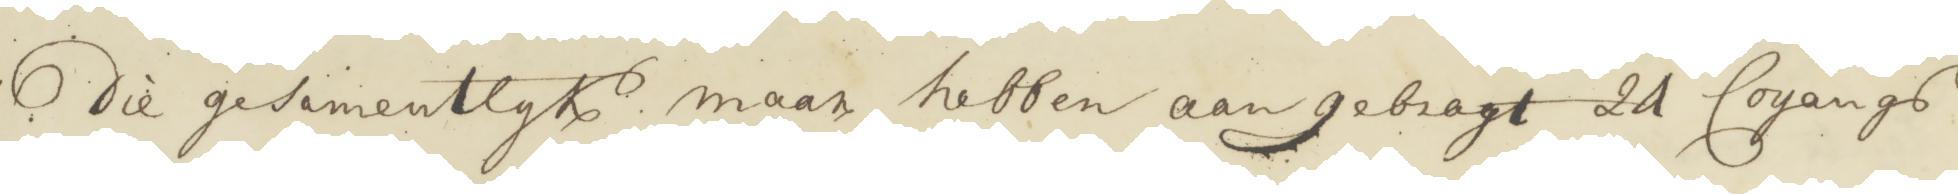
die gesamentlyk maar hebben aan gebragt 24 Coyangs
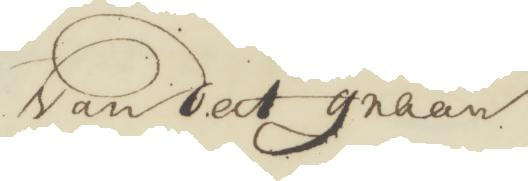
van dat graan.
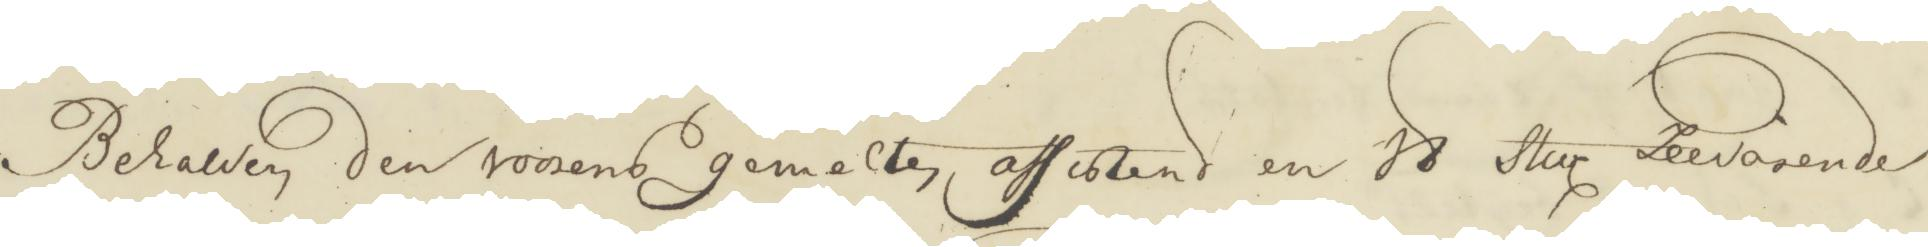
Behalven den voorens gemelten assistend en 18 stux zeevarende
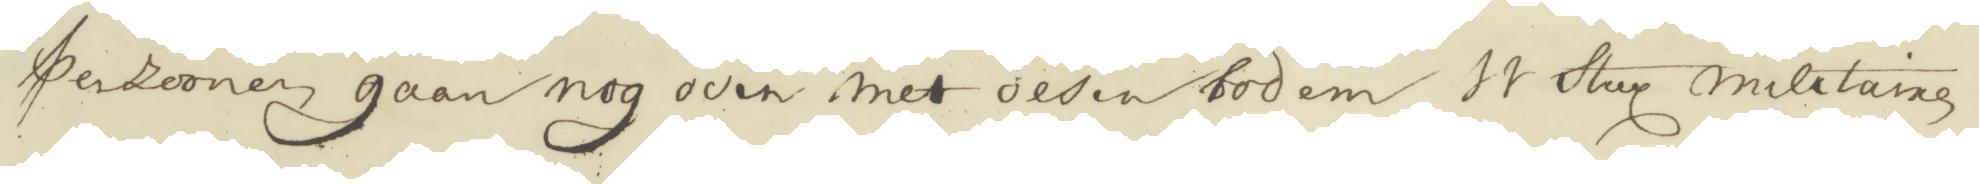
Perzoonen gaan nog over met desen bodem 11 stux militairen
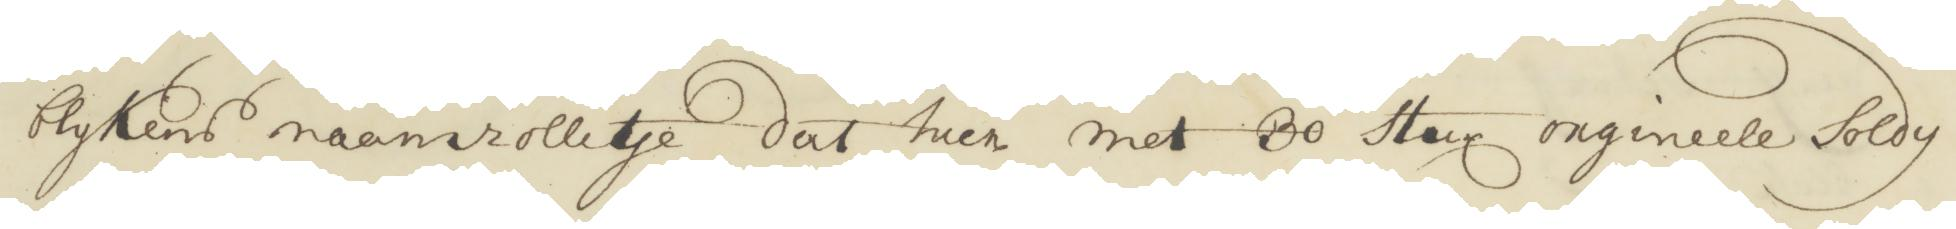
blykens naamrolletje dat hier met 30 stux orgineele soldy
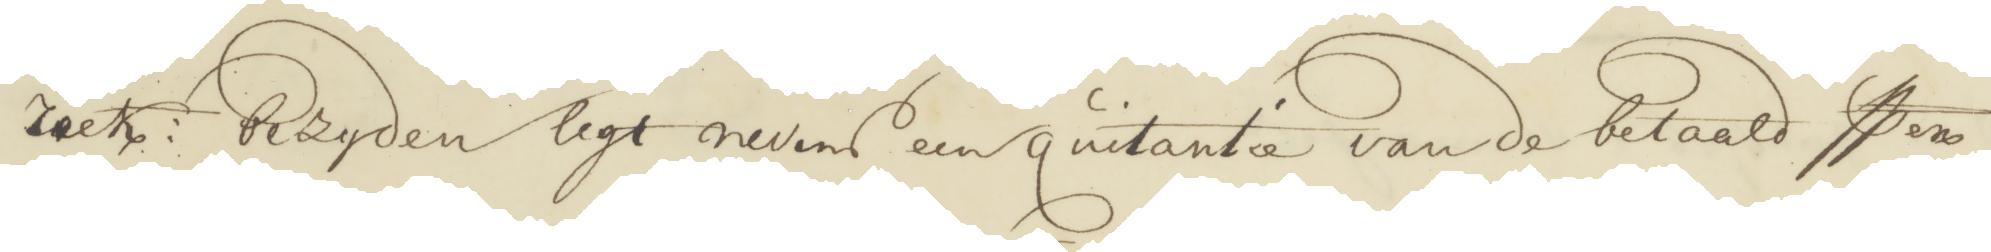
reek: bezyden ligt nevens een quitantie van de betaald pper
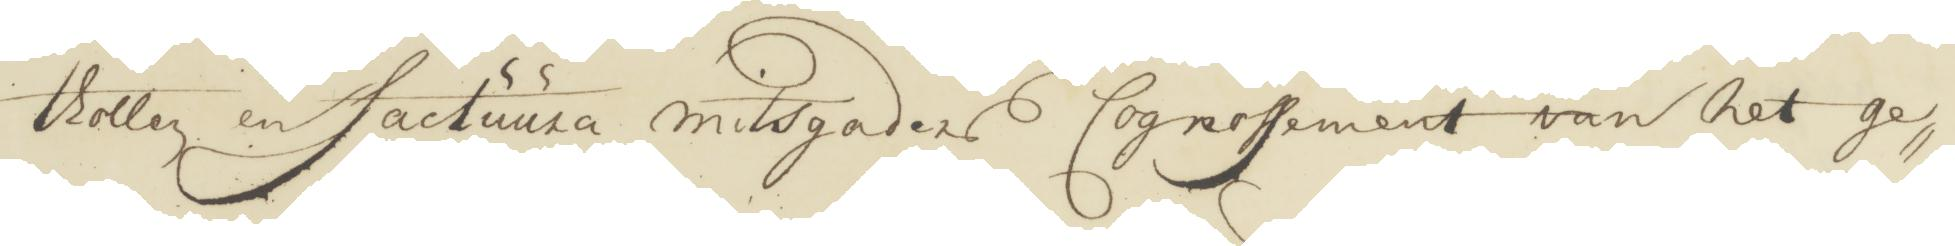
thollen en factuura mitsgaders Cognossement van het ge„
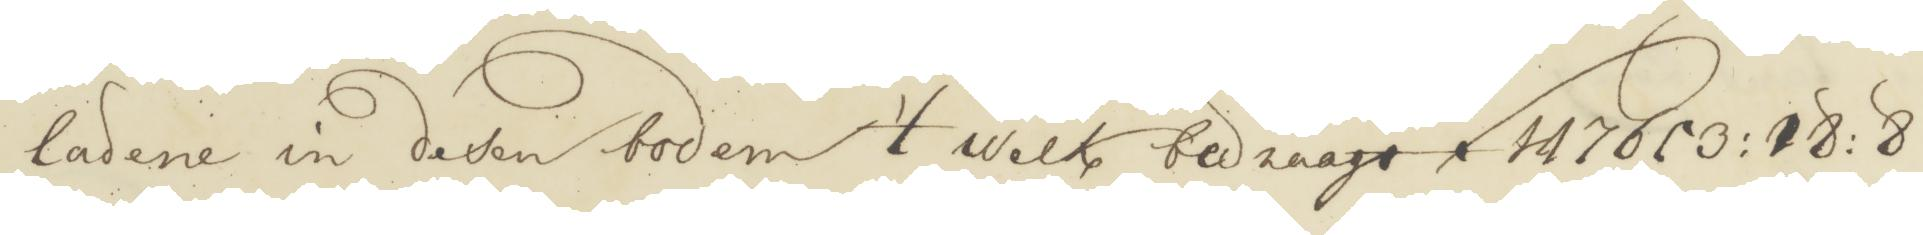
ladene in desen bodem ’t welk bedraagt ƒ 147653: 18: 8
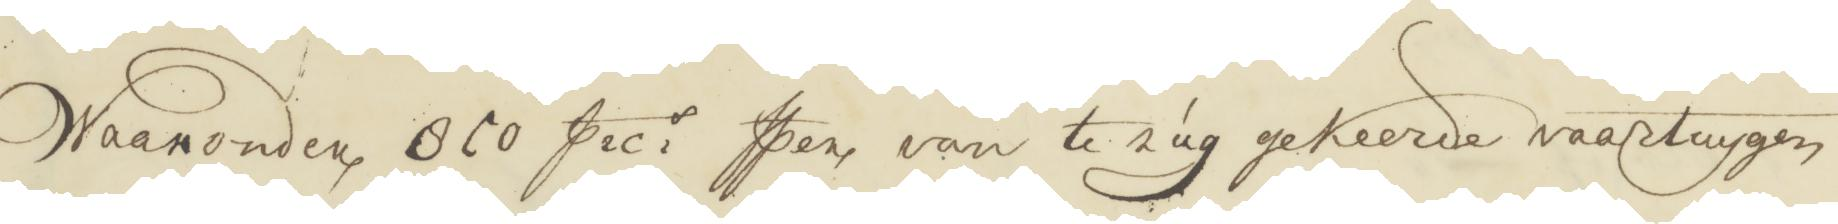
Waaronder 850 pic:s pper, van te rug gekeerde vaartuygen
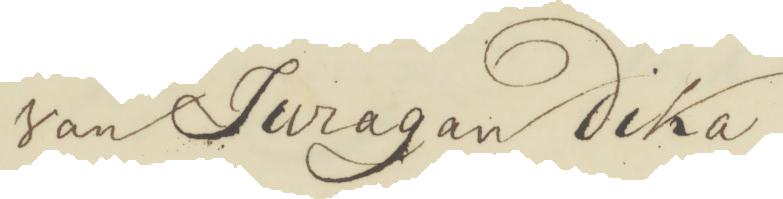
van Iuragan Dika
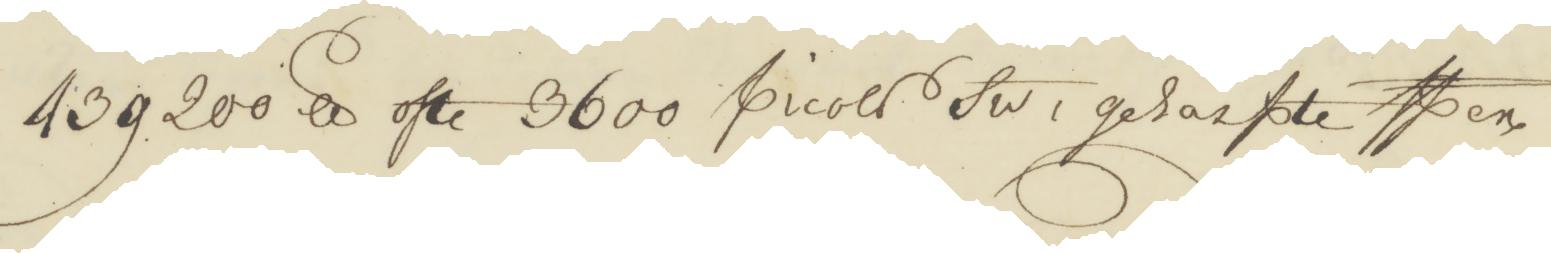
439200 lb ofte 3600 picols sw: geharpte pper
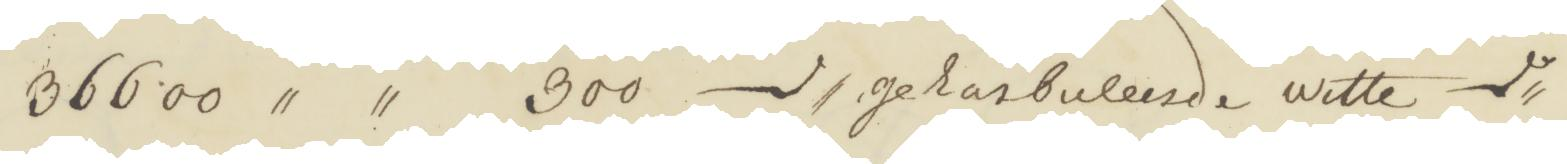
36600 „ „ 300 d„o, geharbuleerde witte d„o
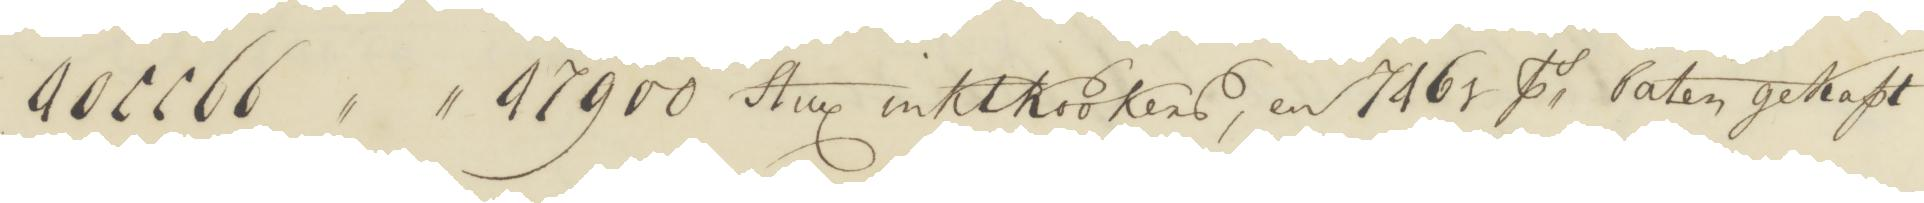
405566 „ „ 47900 stux inktkookers, en 7461 p„s baten gekapt
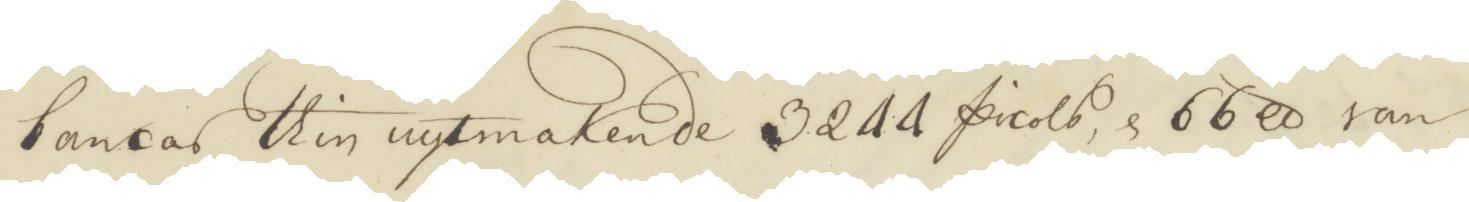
bancas thin uijtmakende 3244 picols, en 66 lb van
